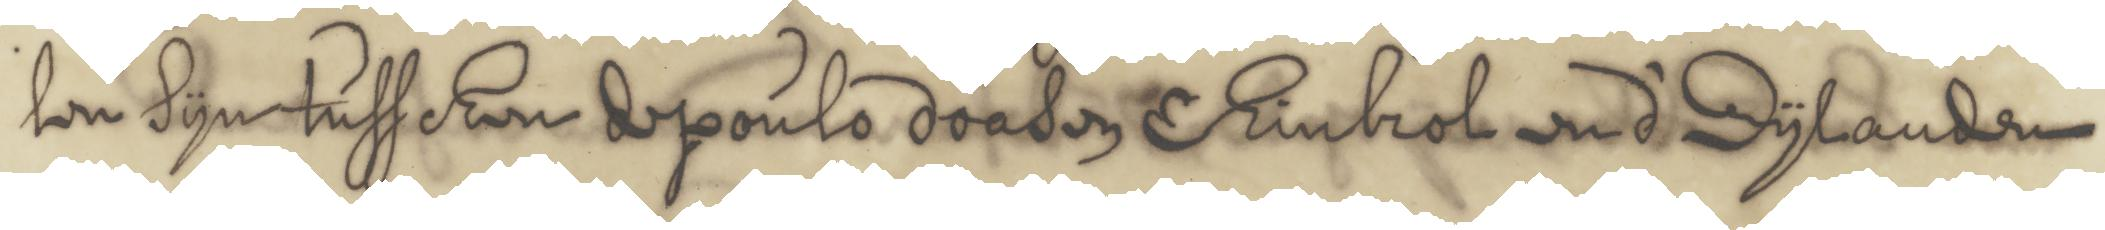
len sijn tussen de poulo doas en Chinkol en d’Eijlanden
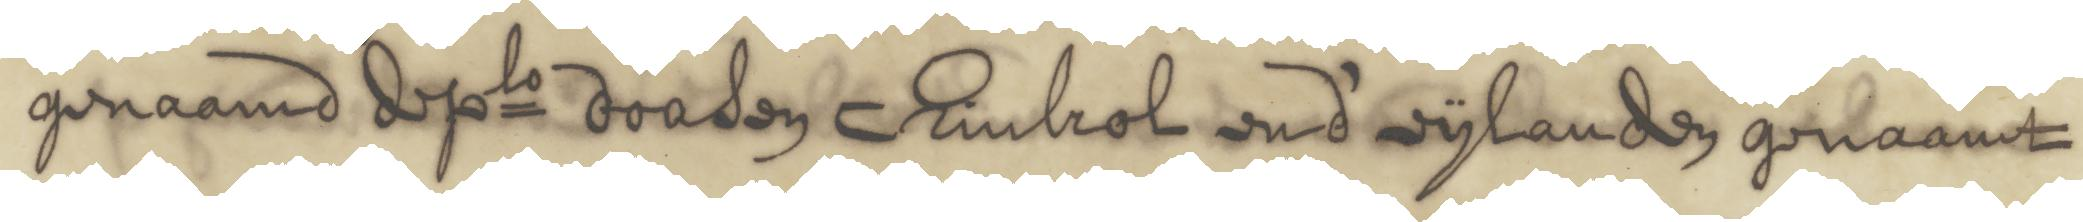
genaamd de p=lo doas en Chinkol en d’eijlanden genaamt
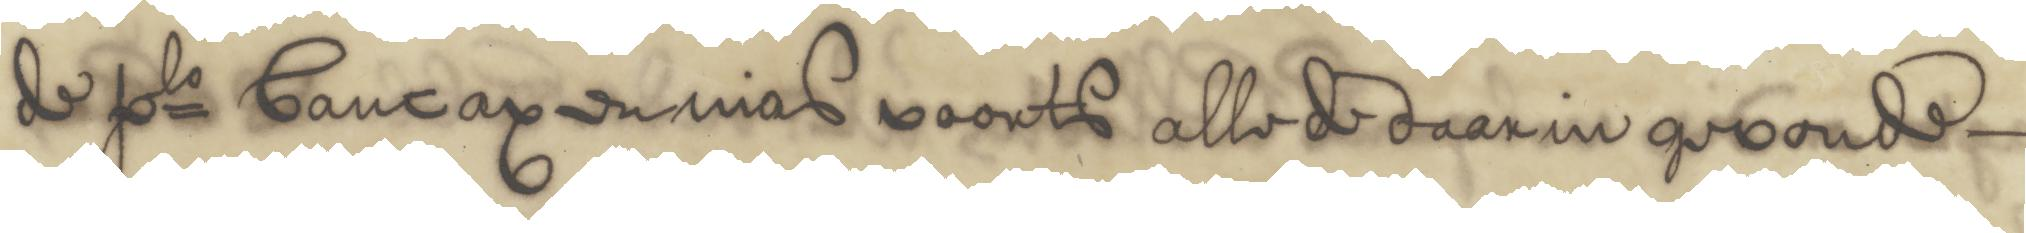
de p=lo Bancax en nias voorts alle de daarin gevonde—
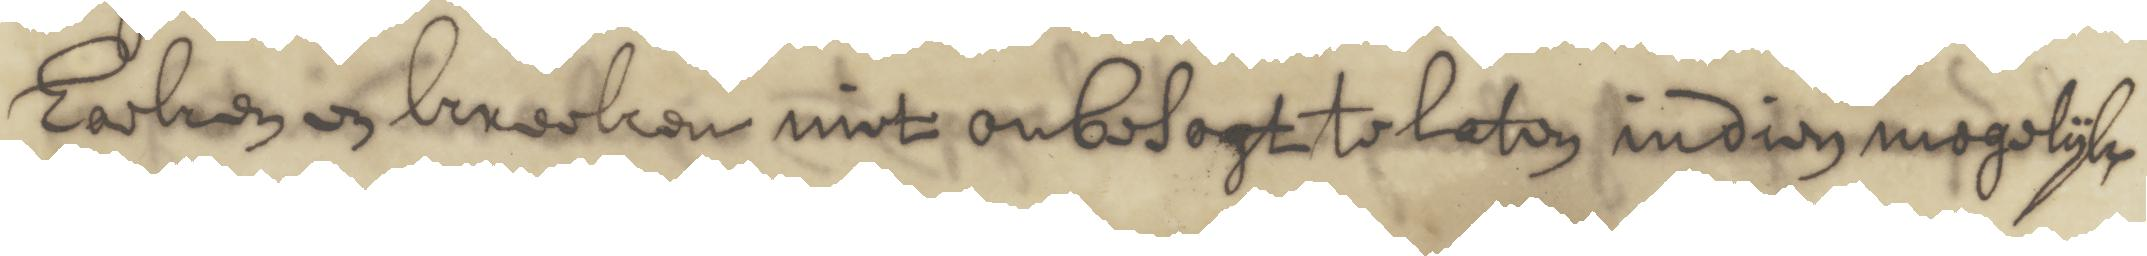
hoeken en kreeken niet onbesogt te laten indien mogelijk
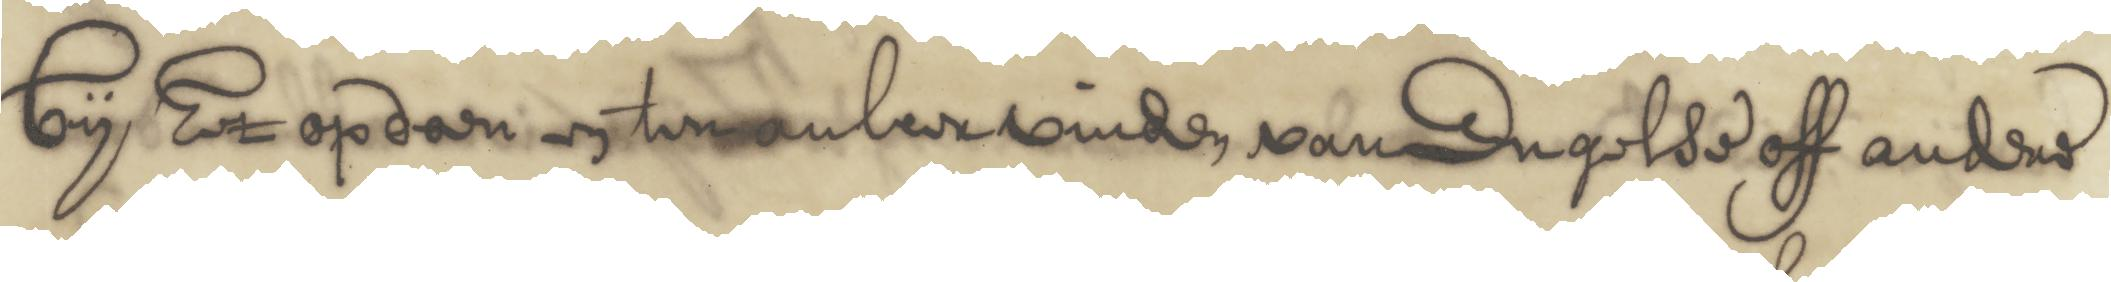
bij het opdoen en ten anker vinden van Engelse off andere
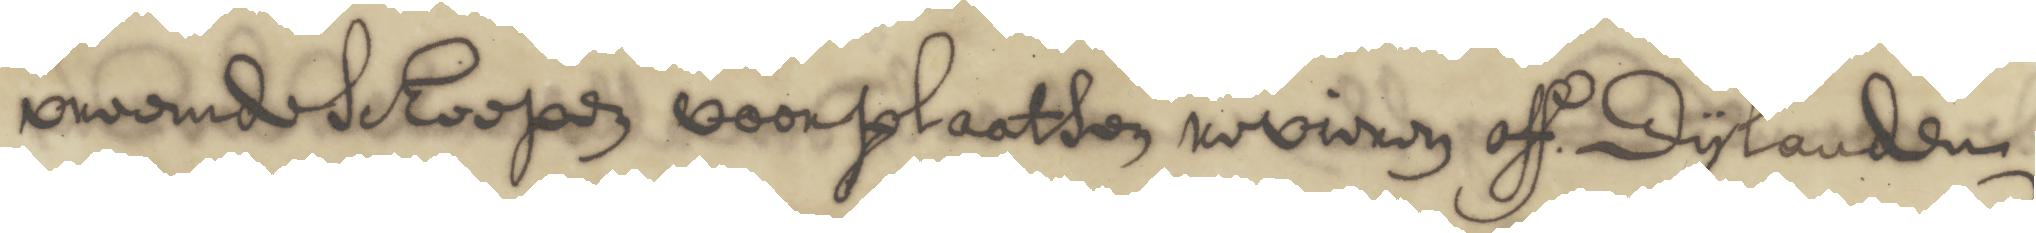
vreemde scheepen voor plaatsen revieren off: Eijlanden
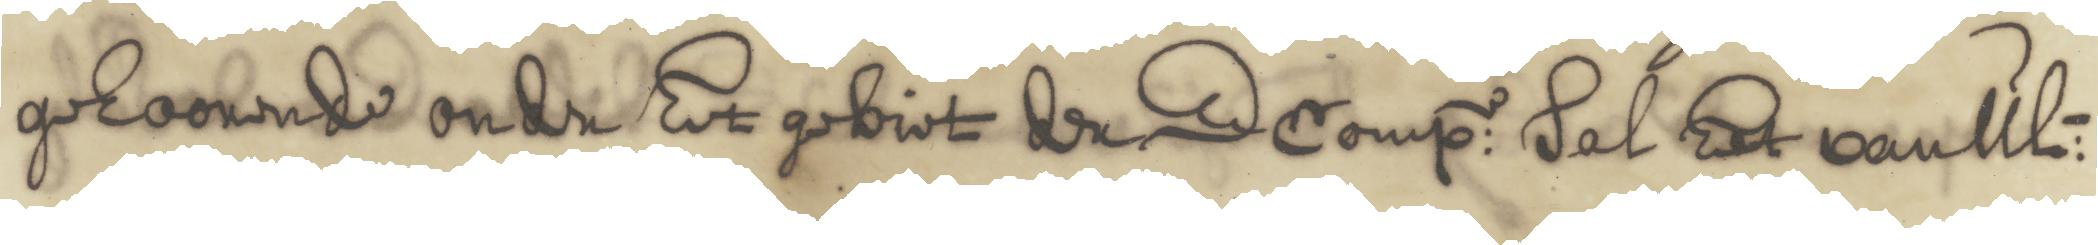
gehoorende onder het gebiet der EComp:e sal het van UL:
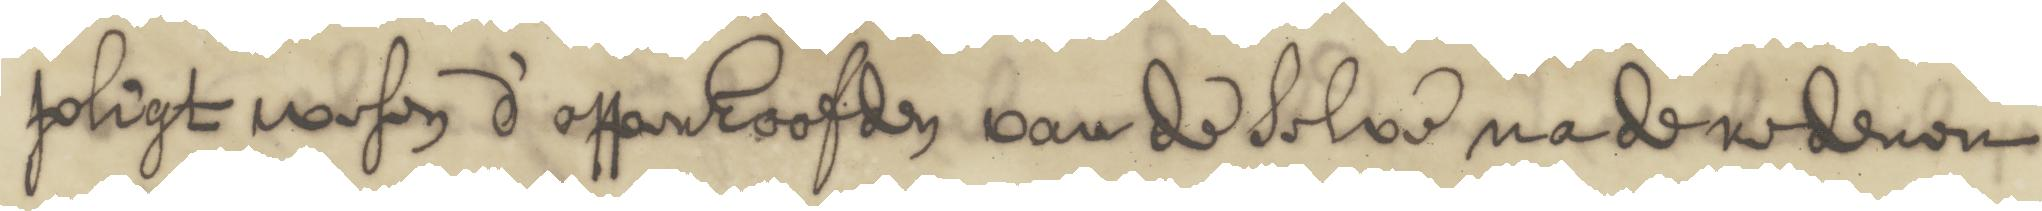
pligt wesen d’opperhoofden van de selve na de redenen
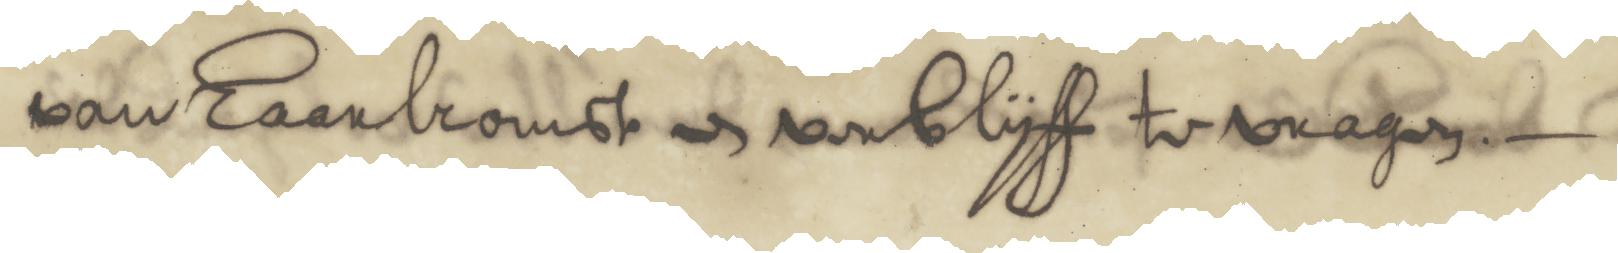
van haar komst en verblijff te vragen.—
